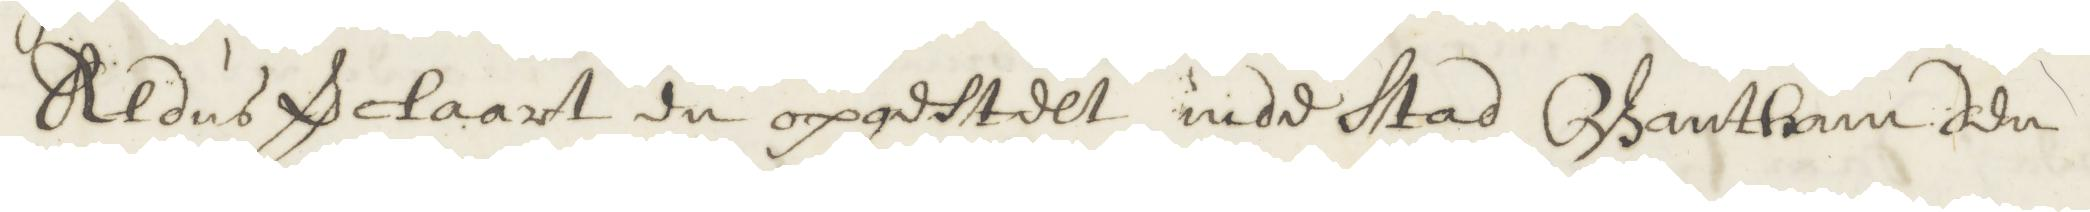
Aldus verclaart en opgestelt inde stad Bantham den
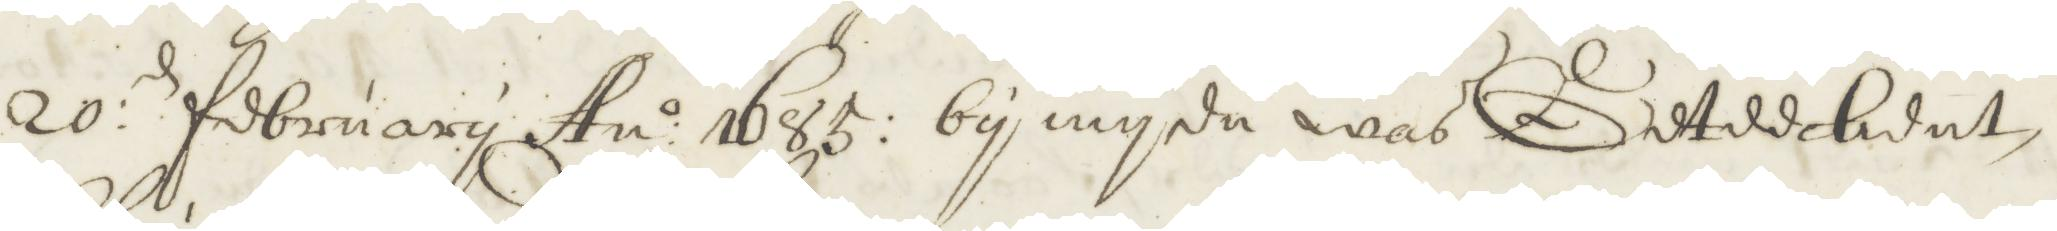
20:en februarij An:o 1685: bij mij en was Geteeckent,
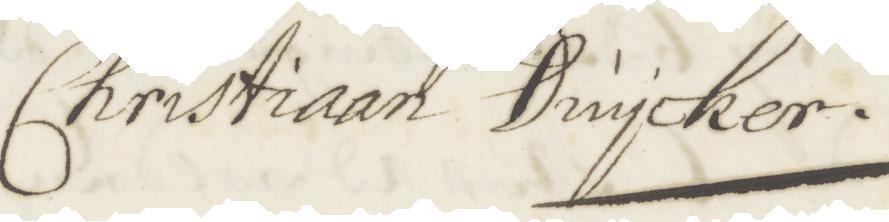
Christiaan Duijcker.
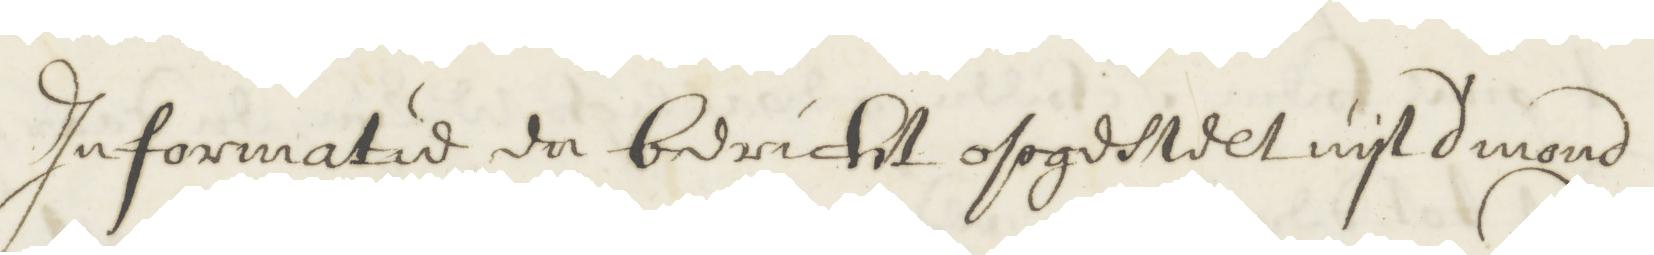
Jnformatie en bericht opgestelt uijt d'mond
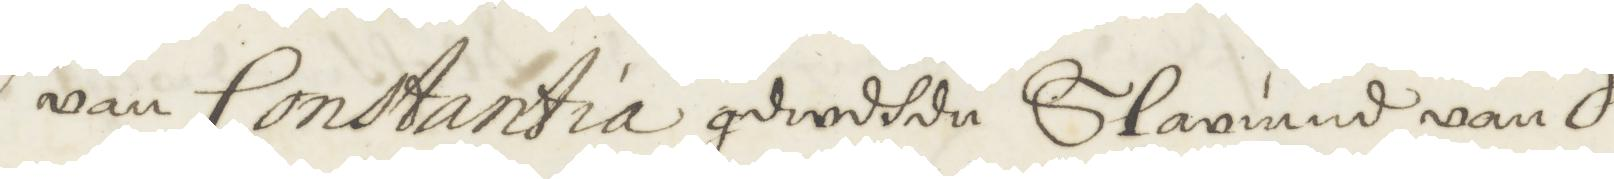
van Constantia gewesen Slavinne van d'
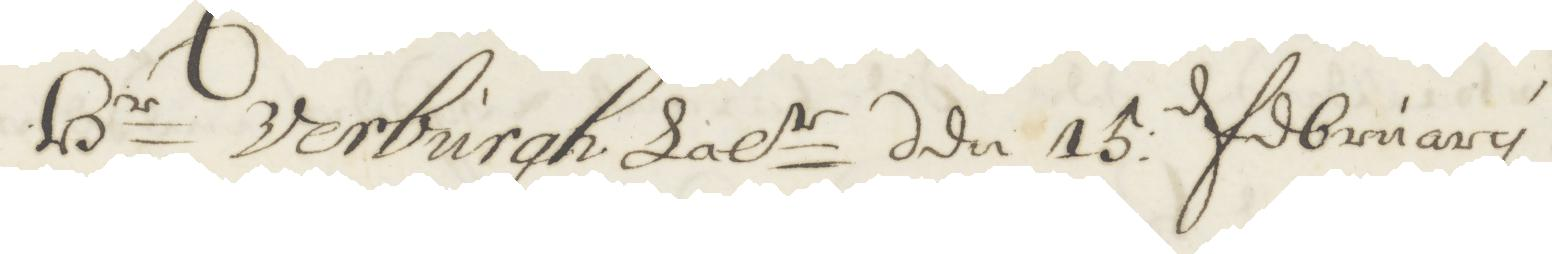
H=r Verburgh Sal=r den 15: februarij
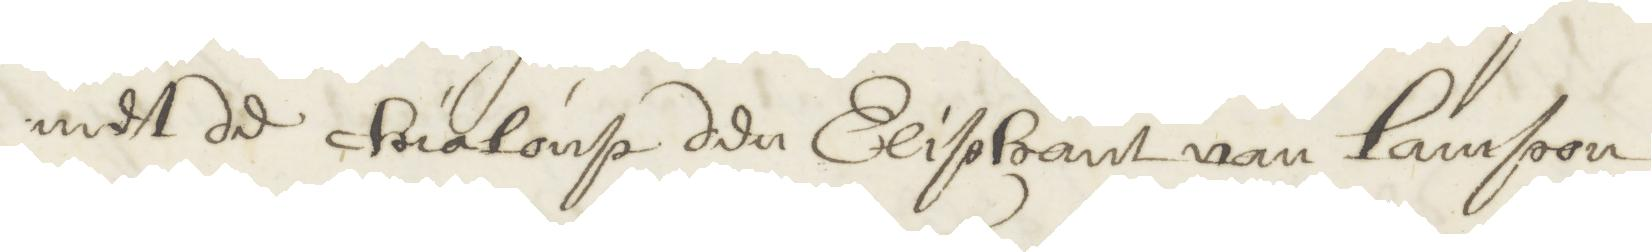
met de chialoup den Eliphant van lampon
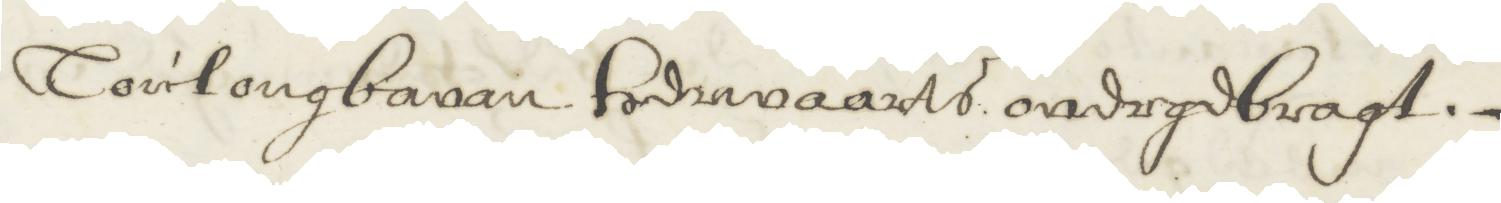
Toulongbavan herwaarts overgebragt.
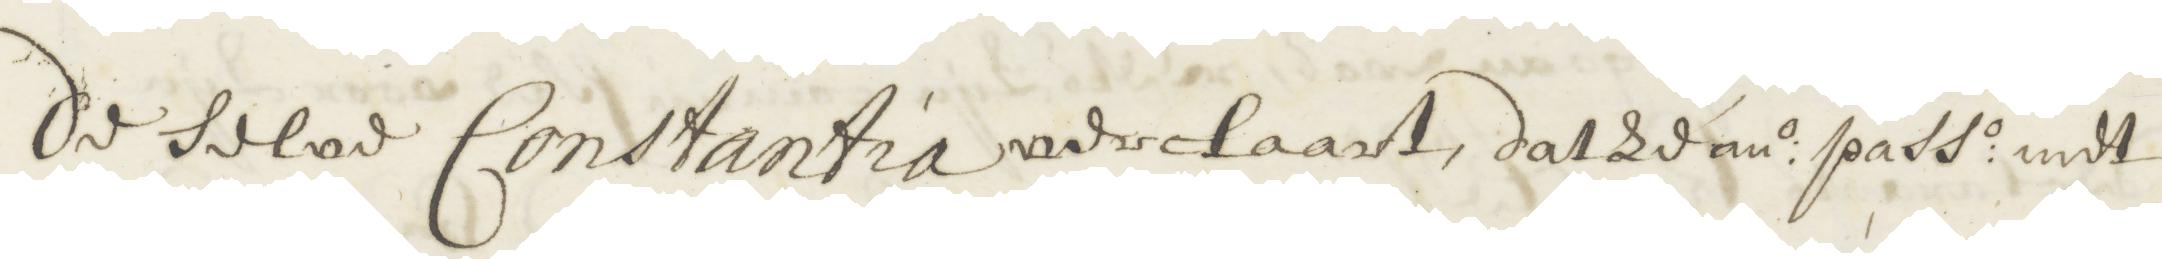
de selve Constantia verclaart, dat ze an:o pass:o met
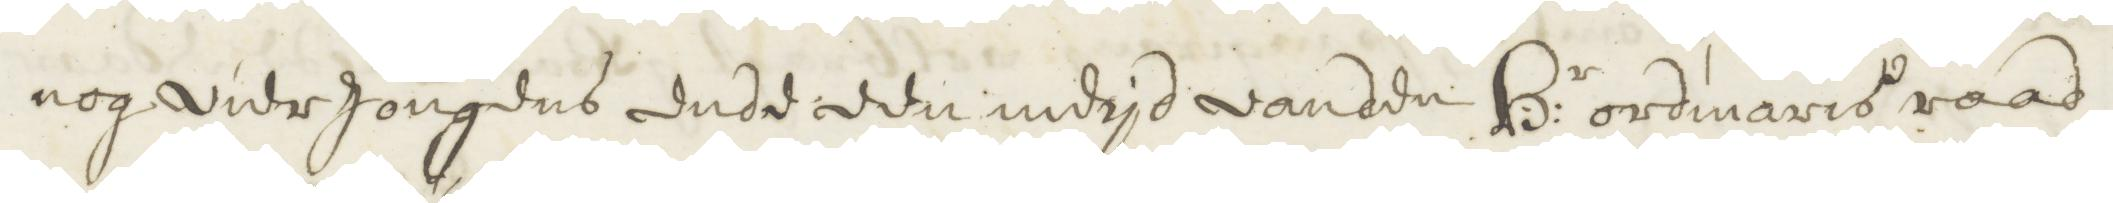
nog vier Jongens ende een meijd van den H:r ordinaris raad
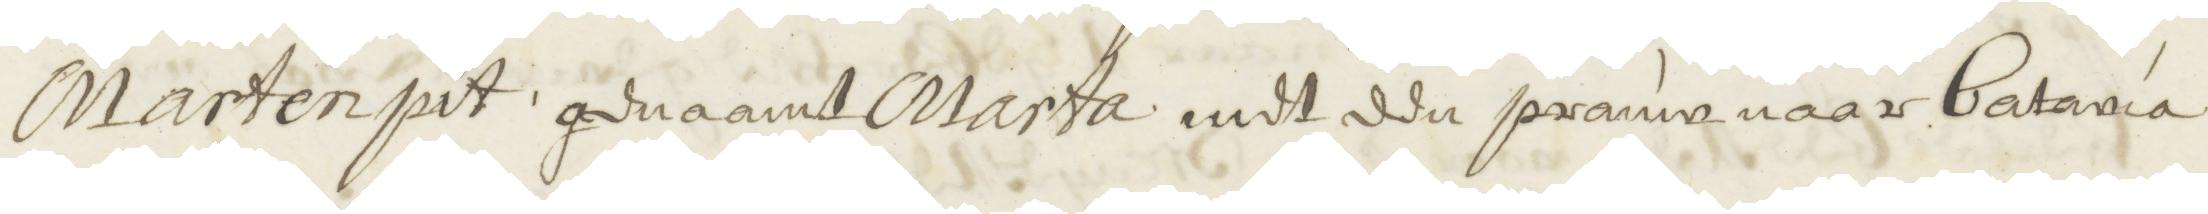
Marten pit genaamt Marta met een prauw naar batavia
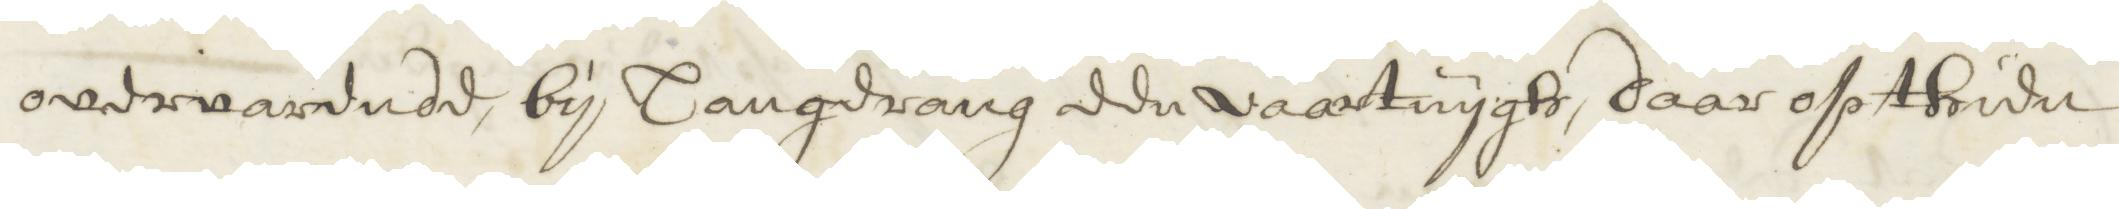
vervarende, bij Tangerang een vaartuijgh, daar op thien
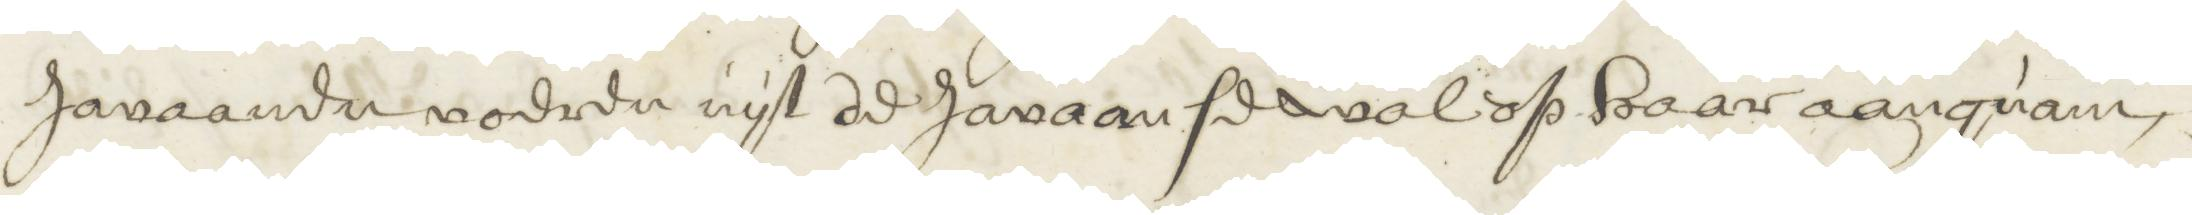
Javaanen voeren uijt de Javaanse wal op haar aanquam,
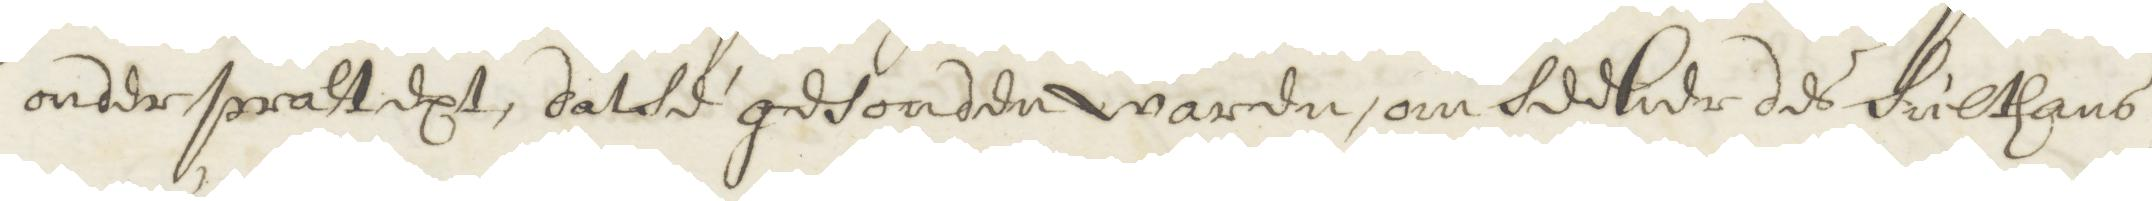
onder praetext, datse' gesonden waren, om seeker des sulthans
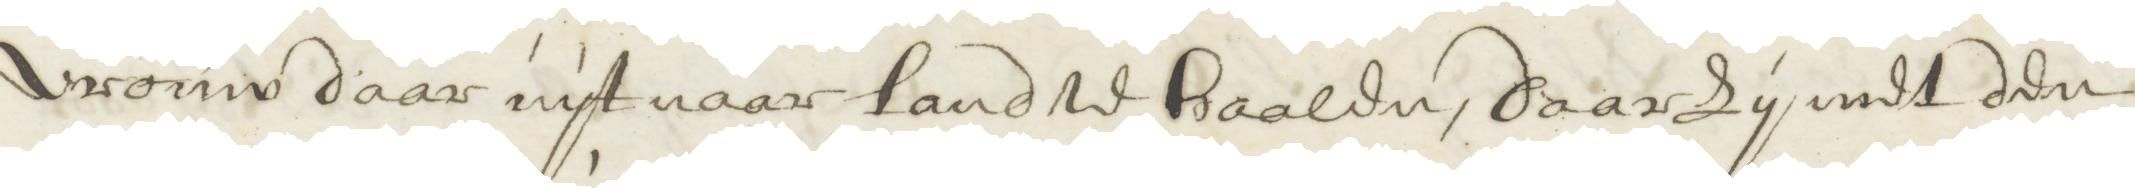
vrouw daar uijt naar land te haalen, daar zij met den
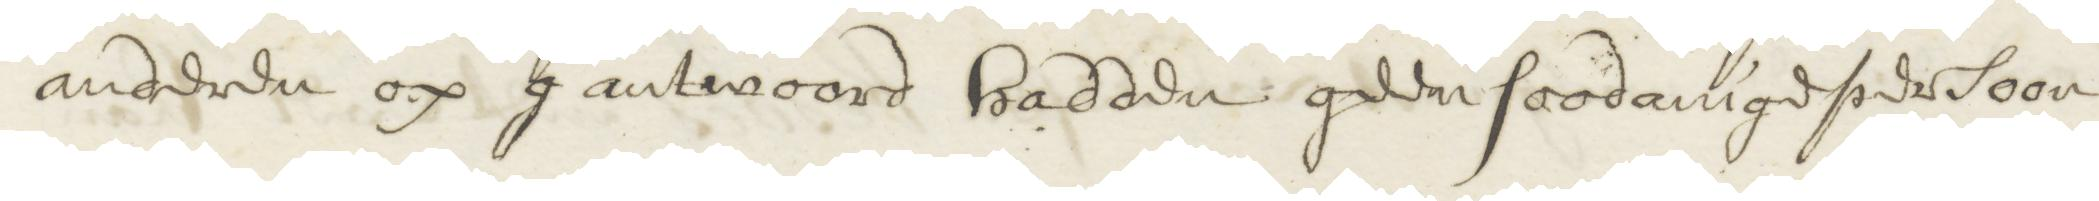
anderen op g'antwoord hadden: geen soodanige persoon
